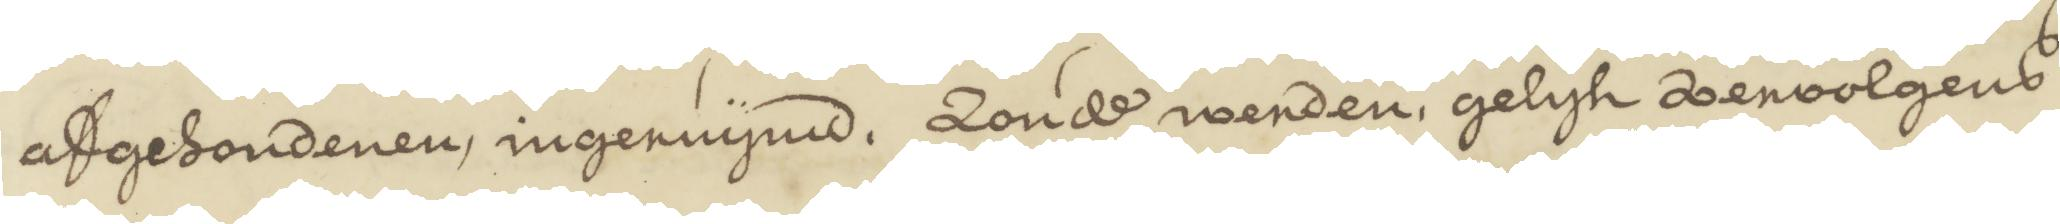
afgesondenen, ingeruijmd, zoude werden, gelijk vervolgens
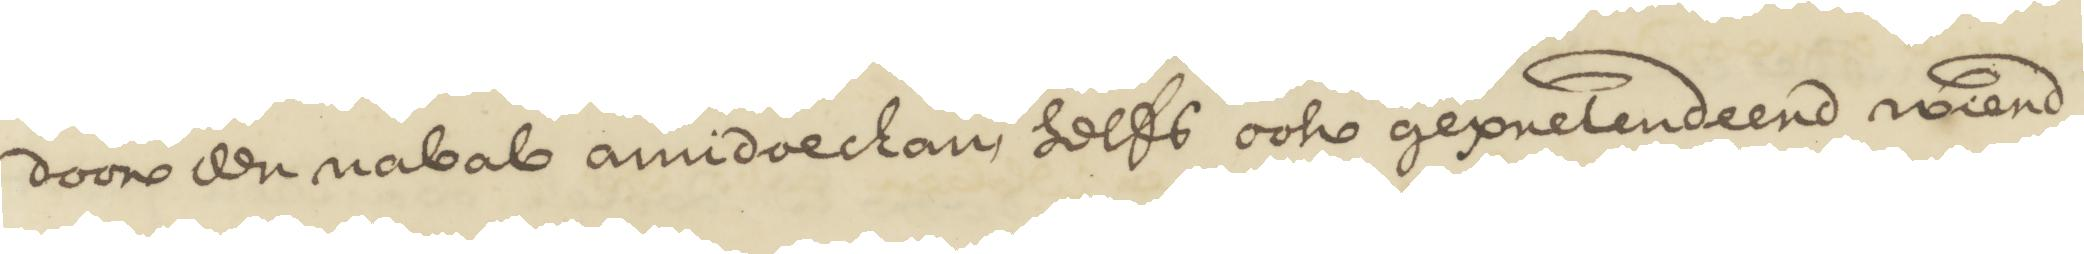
door den nabab amidoechan selfs ook gepretendeerd wierd
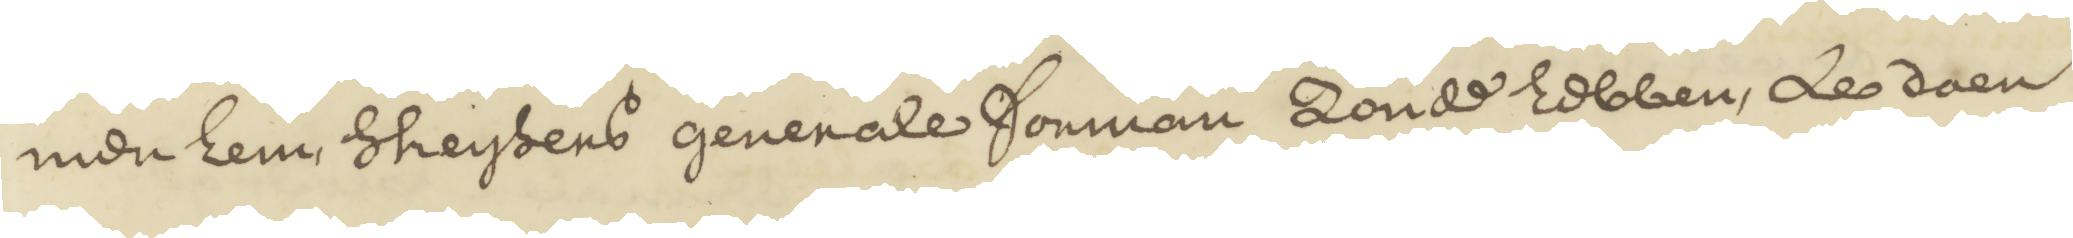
men hem, s'keysers generale forman zoude hebben, te doen
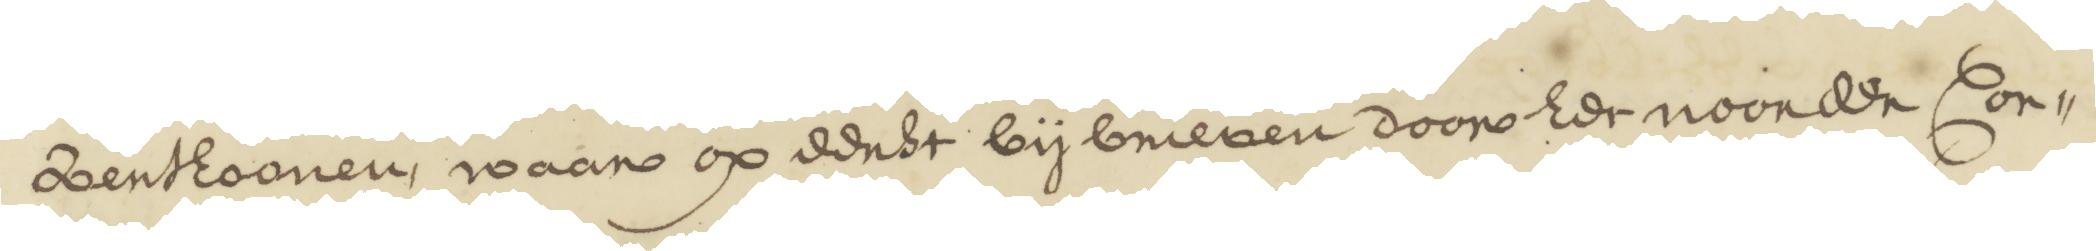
verthoonen, waar op eerst bij brieven door het noorder Cor„
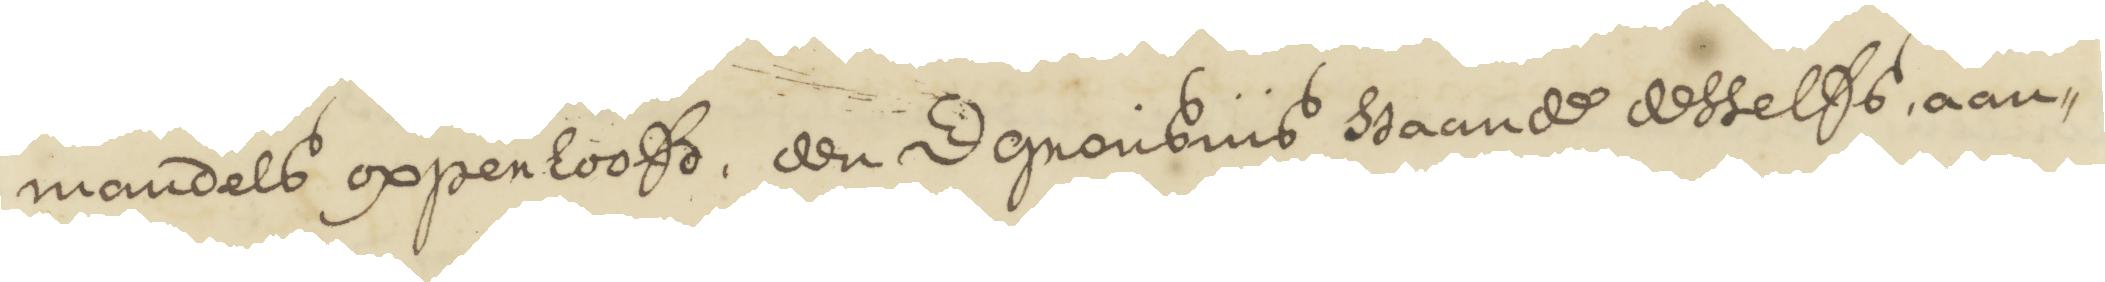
mandels opperhoofd, den Egrousuis staande desselfs, aan„
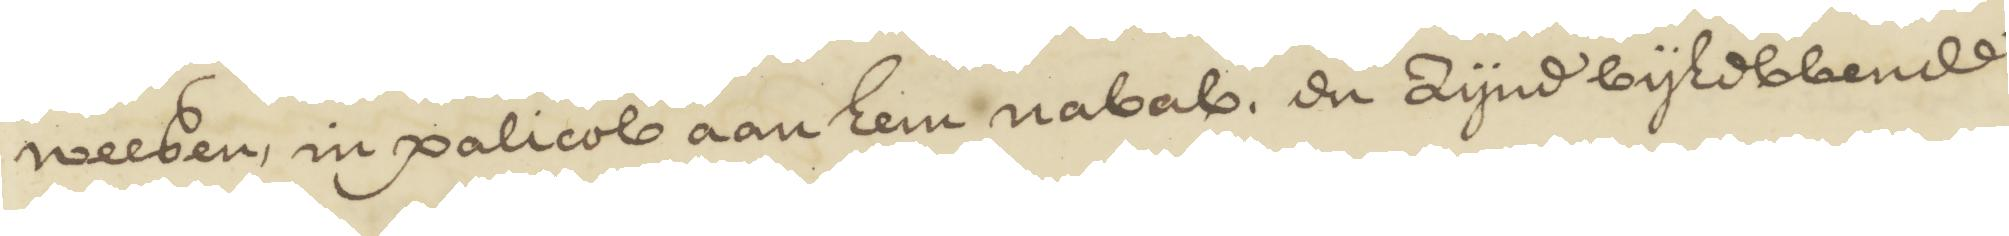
weesen, in palicol aan hem nabab, en zijne bijhebbende
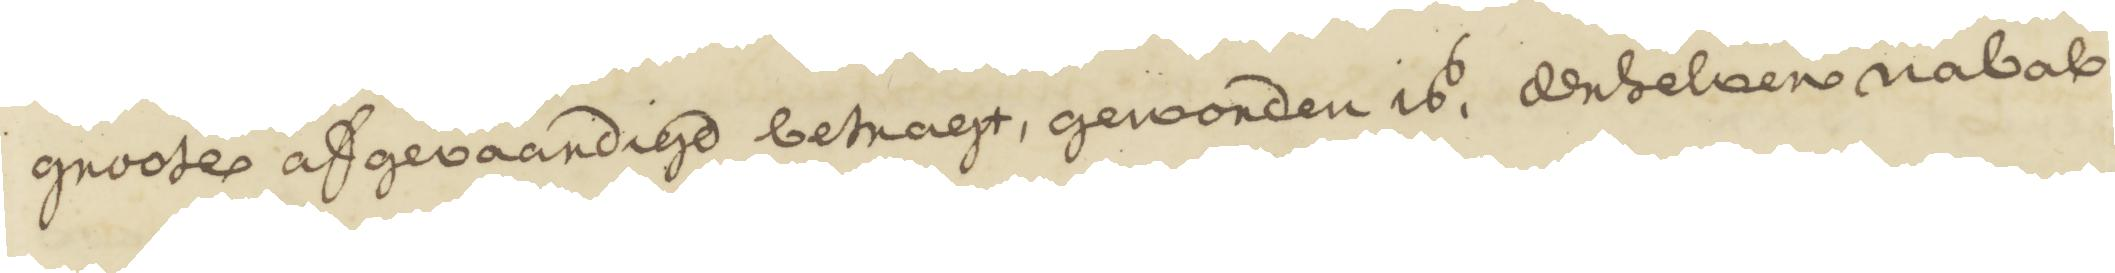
groote afgevaardigd betragt, geworden is, derselver nabab
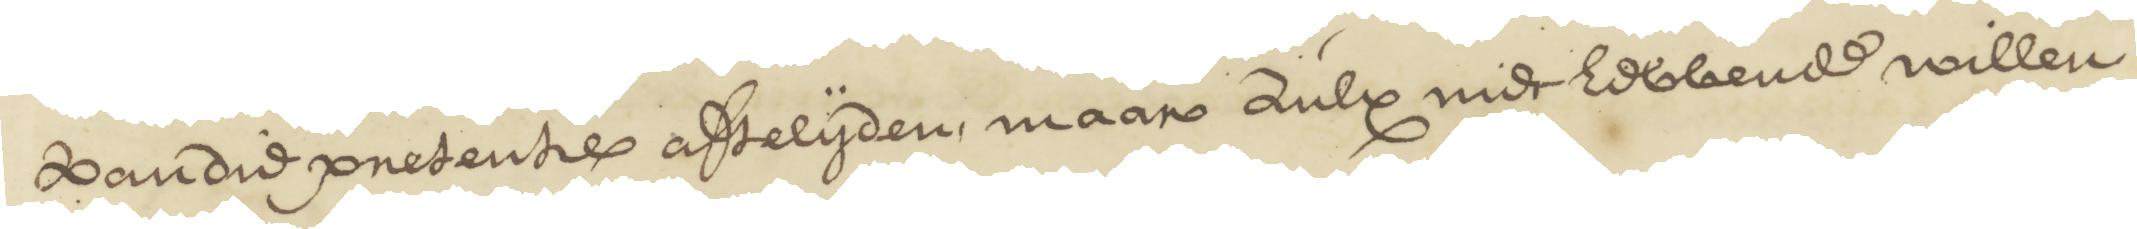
van die presensie aftelijden, maar zulx niet hebbende willen
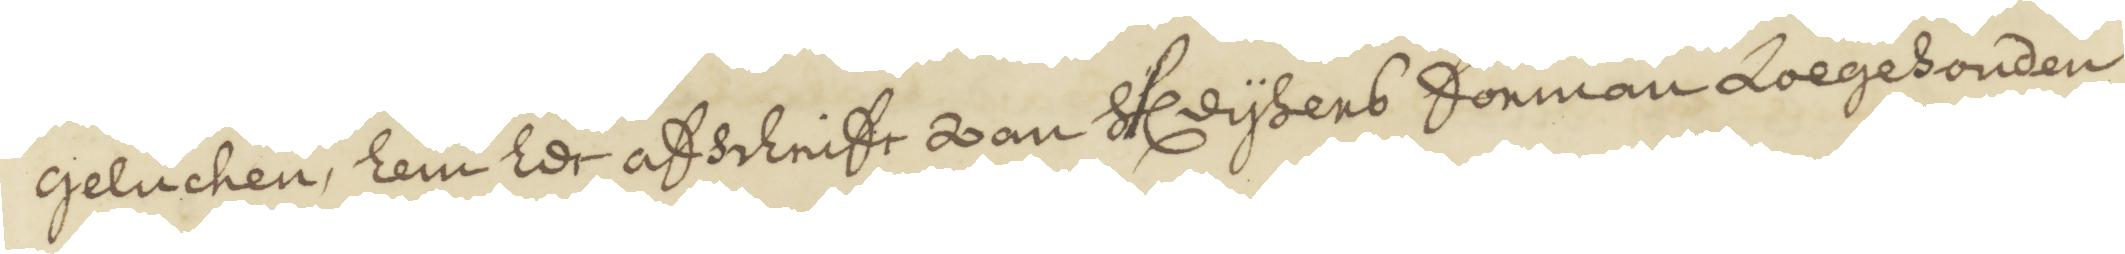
gelucken, hem het afschrift van sKeijsers forman toegesonden
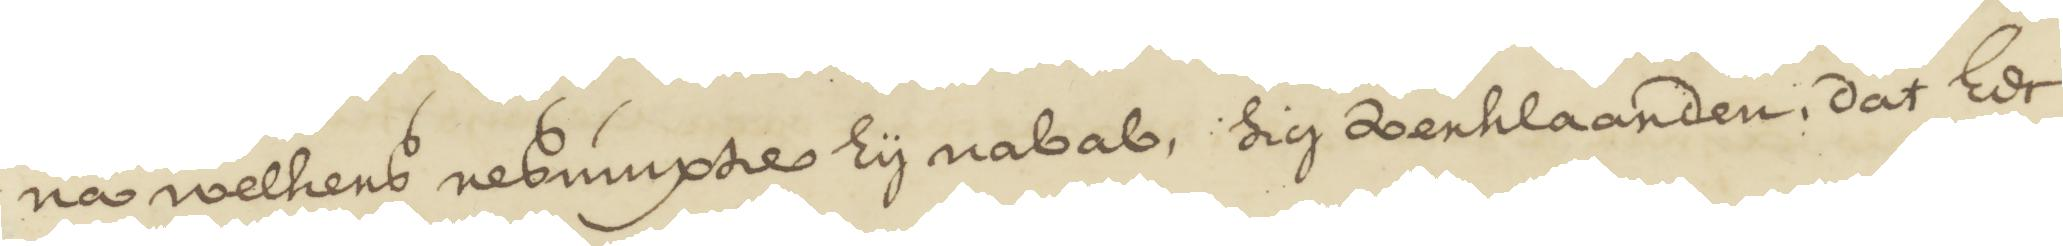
na welkers resumptie hij nabab, sig verklaarden, dat het
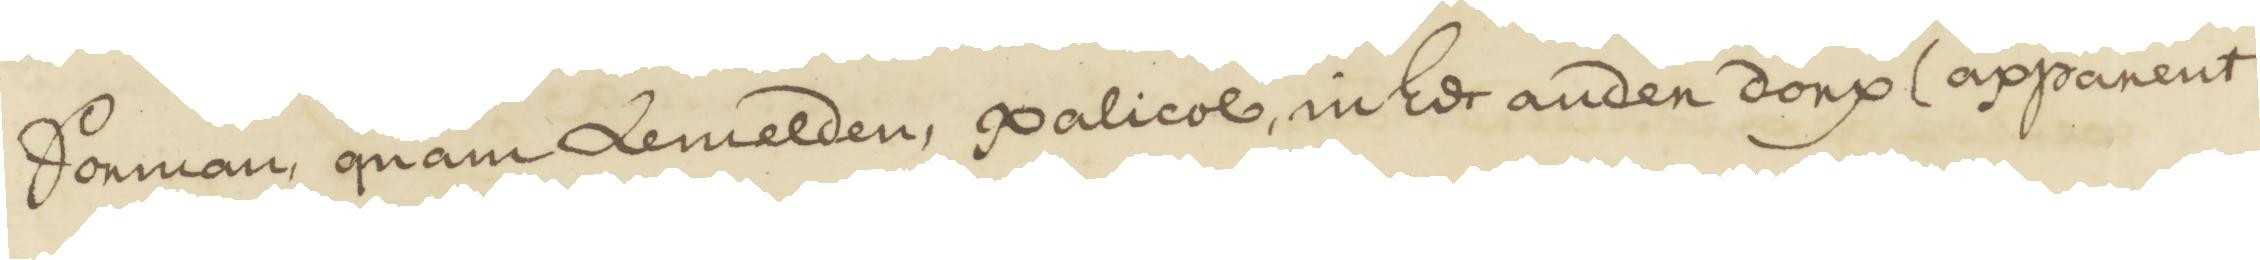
forman, quam temelden, palicol, inhet ander dorp (apparent
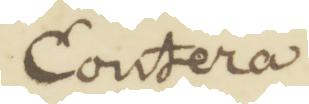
Contera
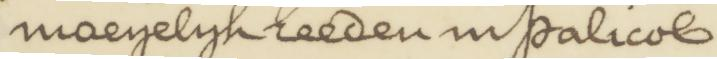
moeijelijkheeden inpalicol
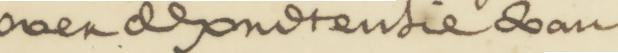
over depretensie van
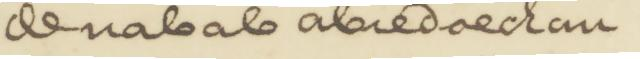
de nabab abiedoechan
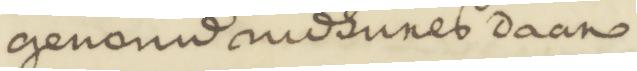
genome mesures daar
